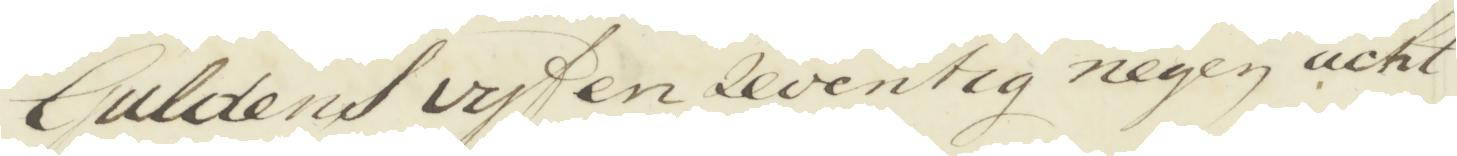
Guldens vyf en zeventig negen acht
